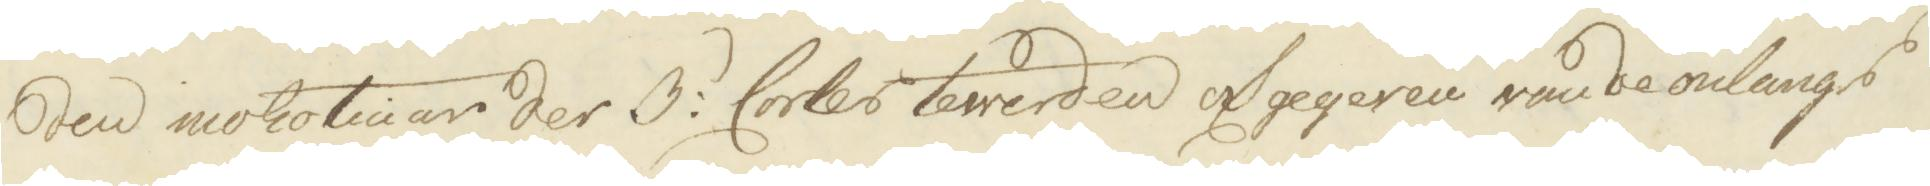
den mohotinar der 3:' Corles tewerden overgegeven van de onlangs
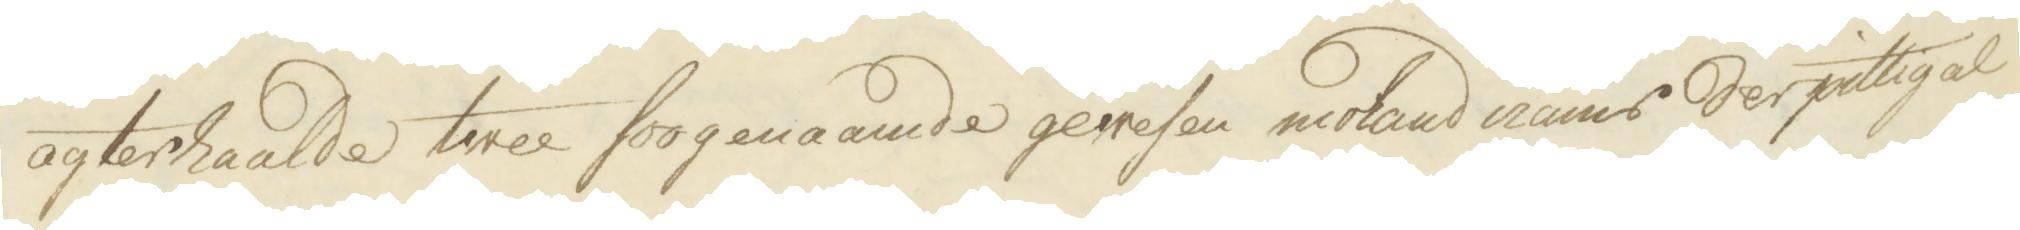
agterhaalde twee soogenaamde gewesen molandirams der pittigal
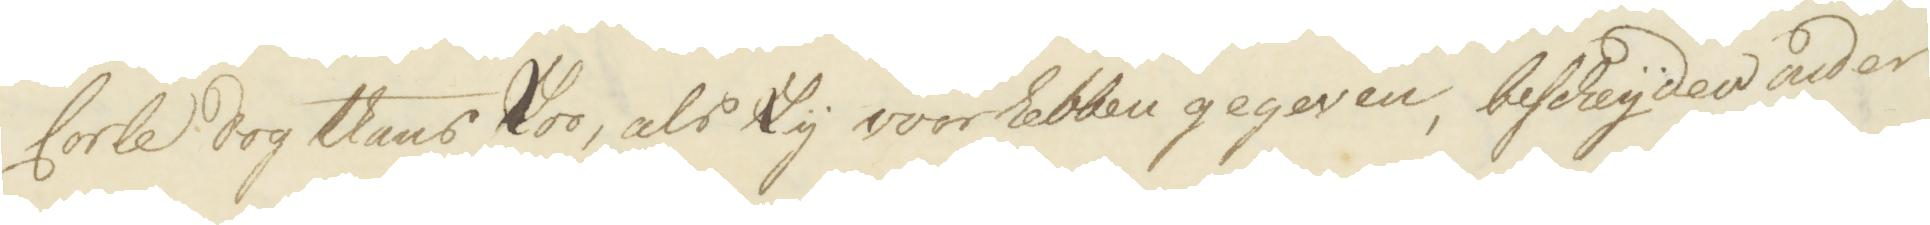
Corle dog thans zoo, als zij voor hebben gegeven, bescheijden onder
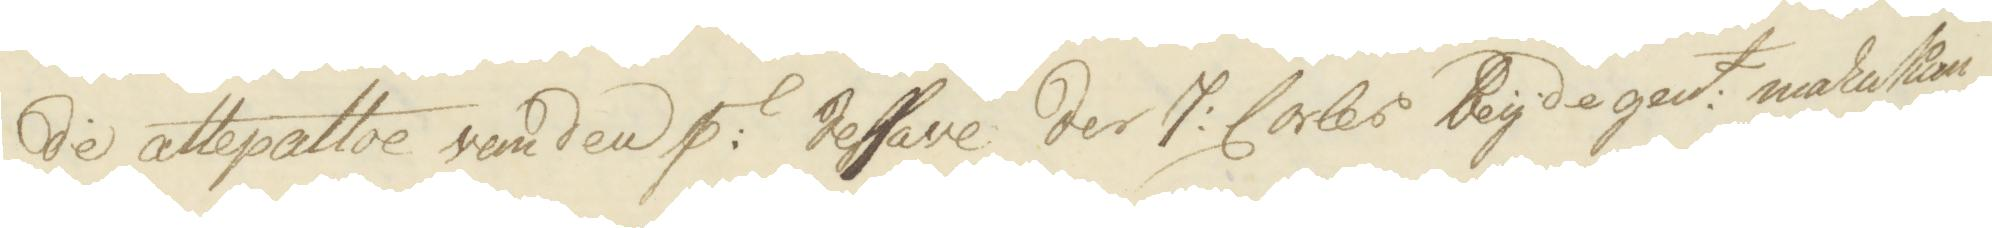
de attepattoe van den p:l dessave der 7: Corles beijde gen:t mahakan
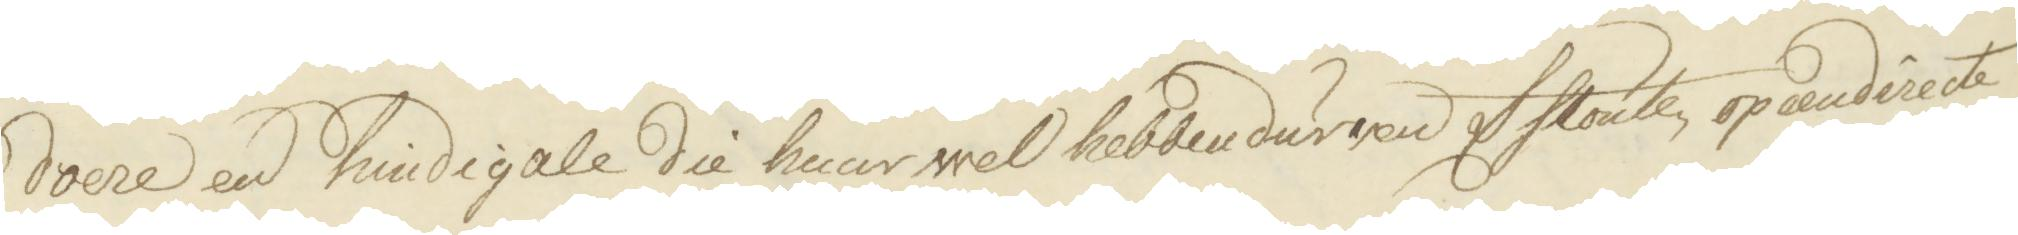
doere en hindigale die haar wel hebben durven verstouten op een directe
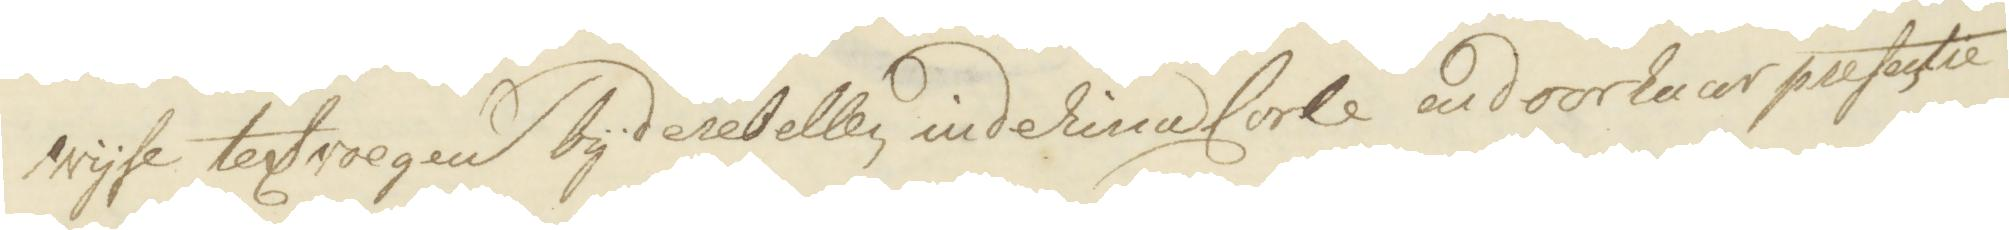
wijse tevervoegen bij derebellen in de hina Corle en door haar presectie
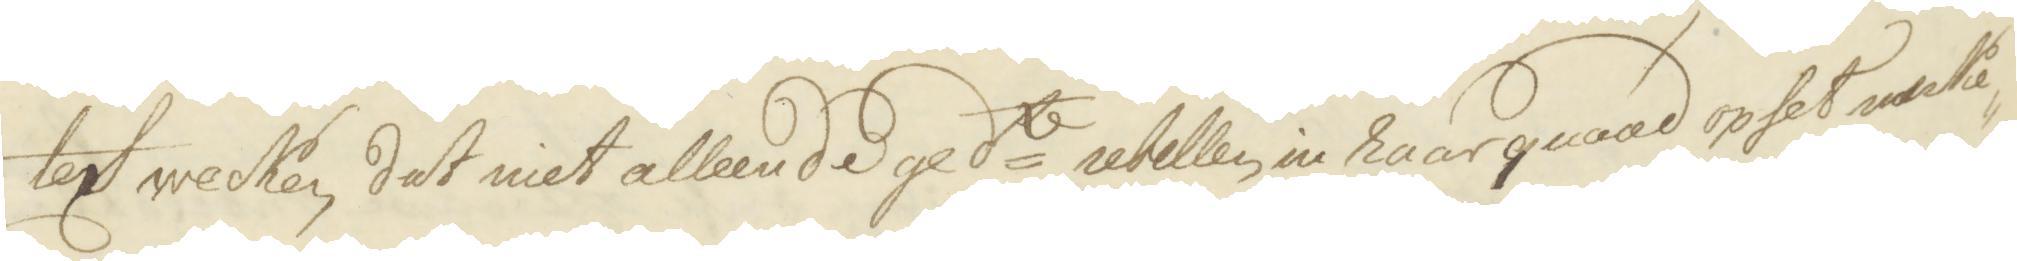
teverwecken dat niet alleen de ged=te rebellen in haar quaad opset werke„
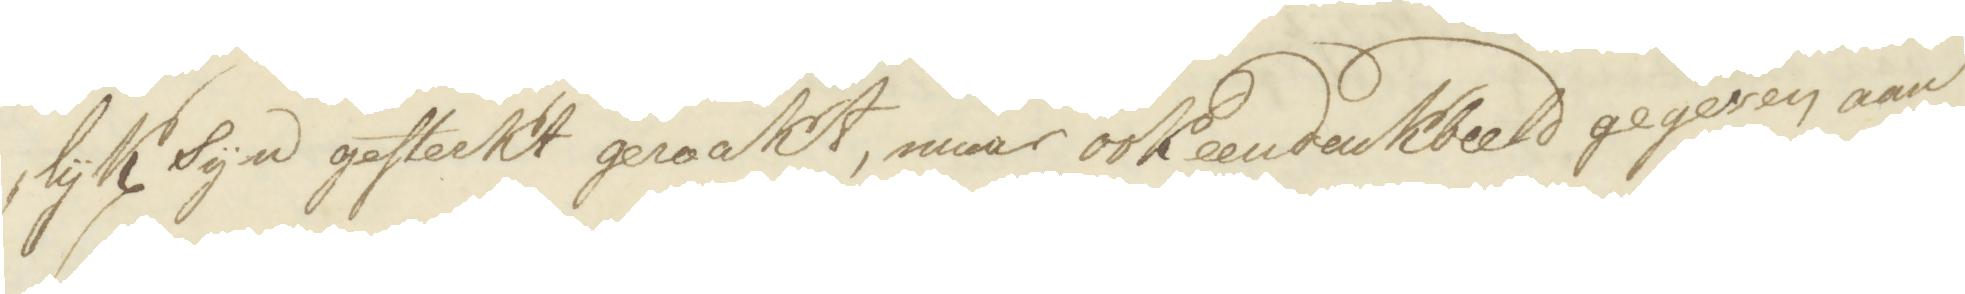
„lijk sijn gesterkt geraakt, maar ook een denkbeeld gegeven aan
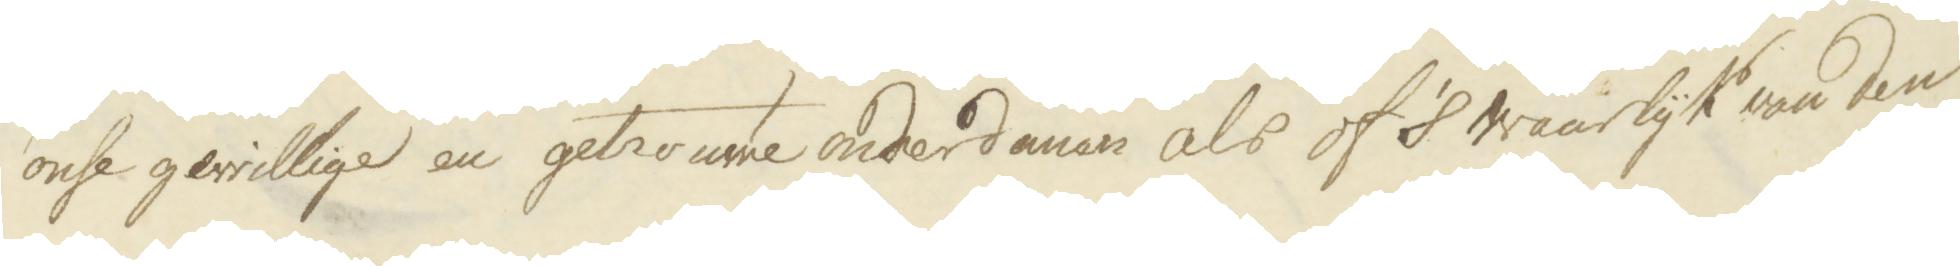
onse gewillige en getrouwe onderdanen als of 's waarlijk van den
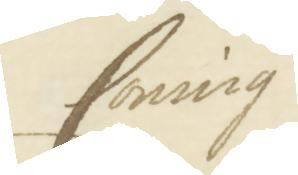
Coning
